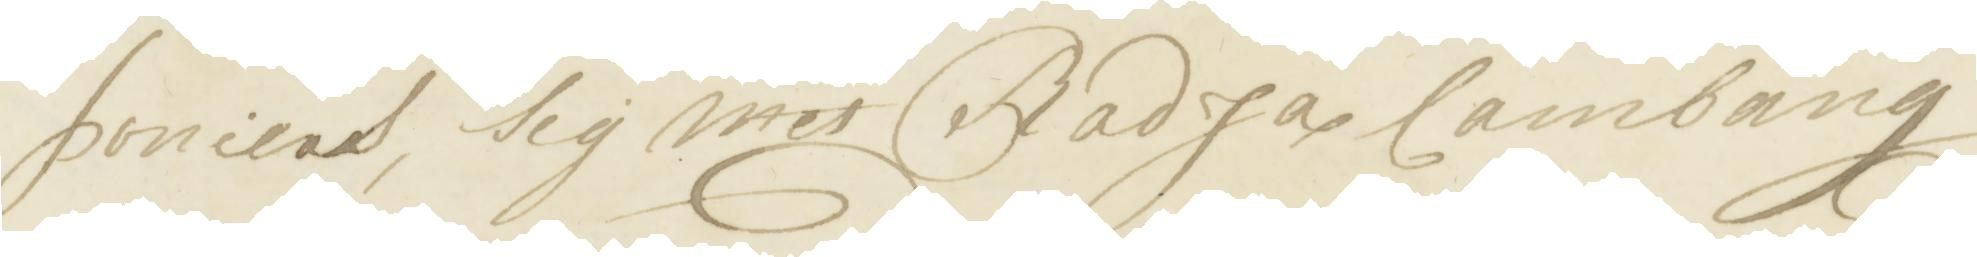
poniers, sig met Radja Cambang
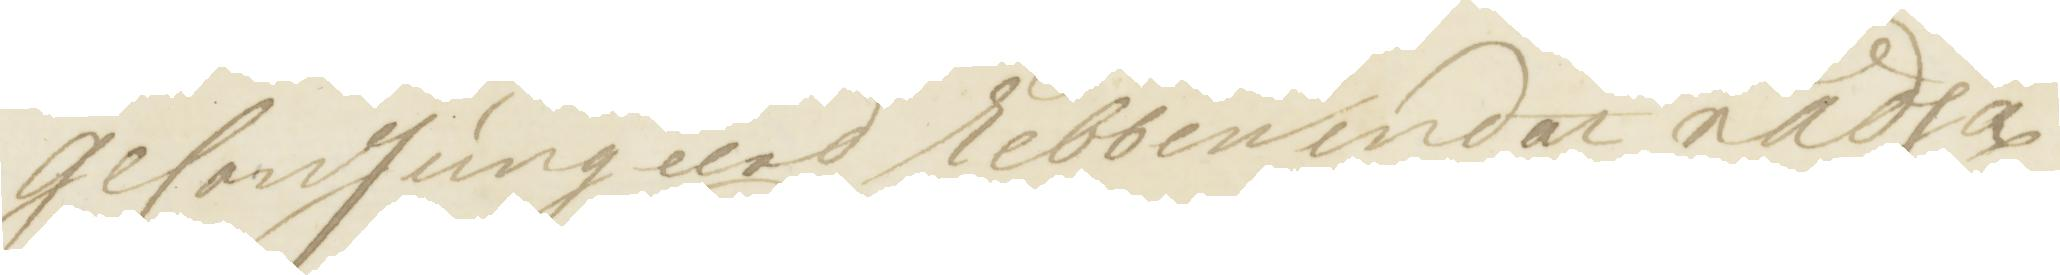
geconjungeerd hebben en dat radja
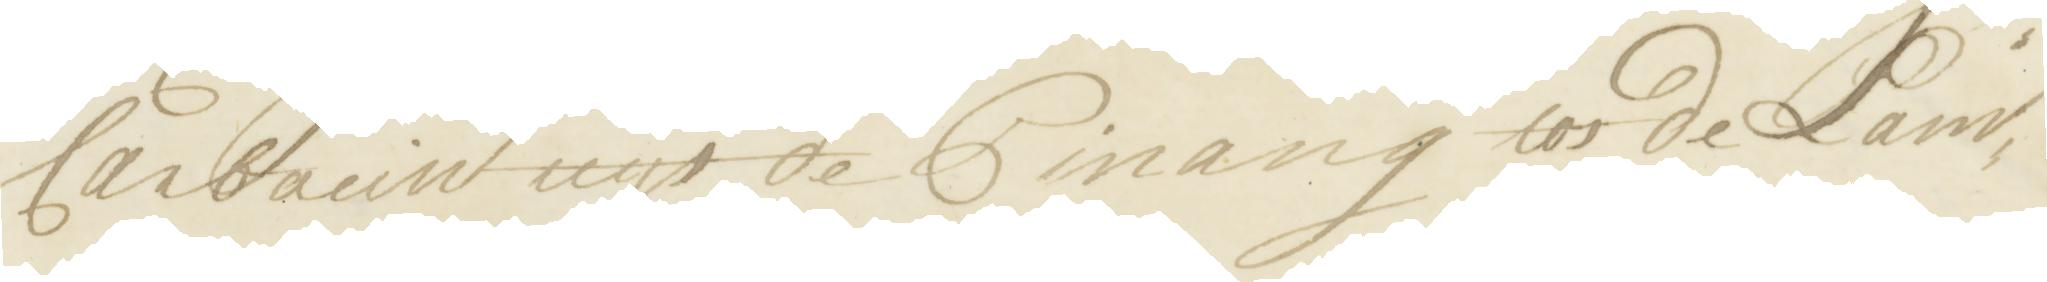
carbauw uyt de Pinang tot de Lam„
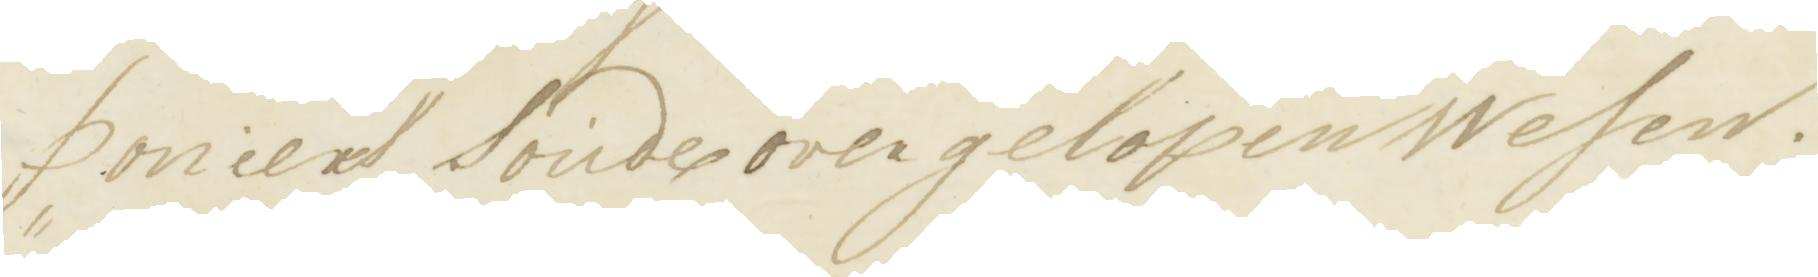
„poniers soude over gelopen wesen.
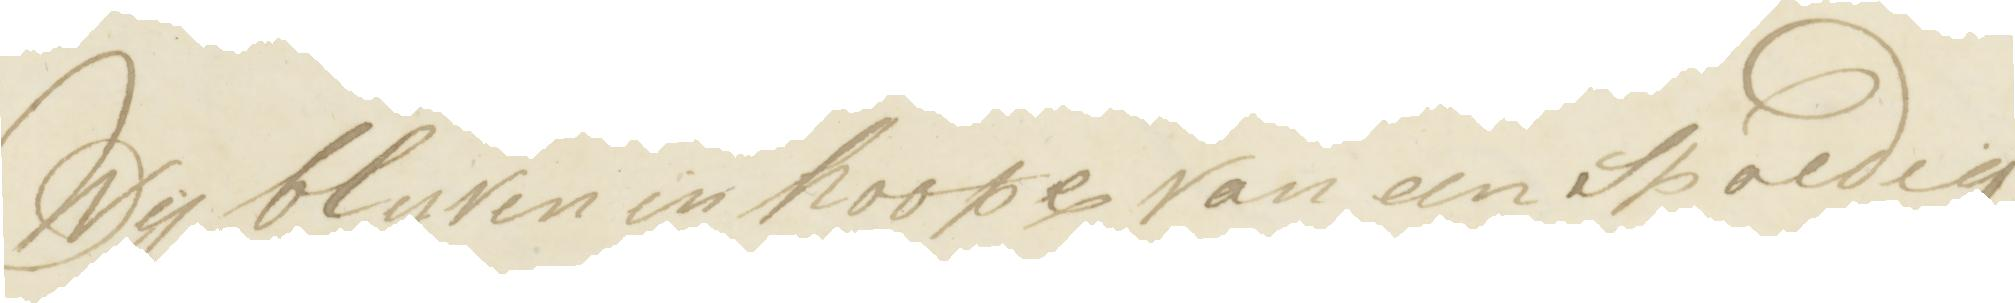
Wij blyven in hoope van een spoedig
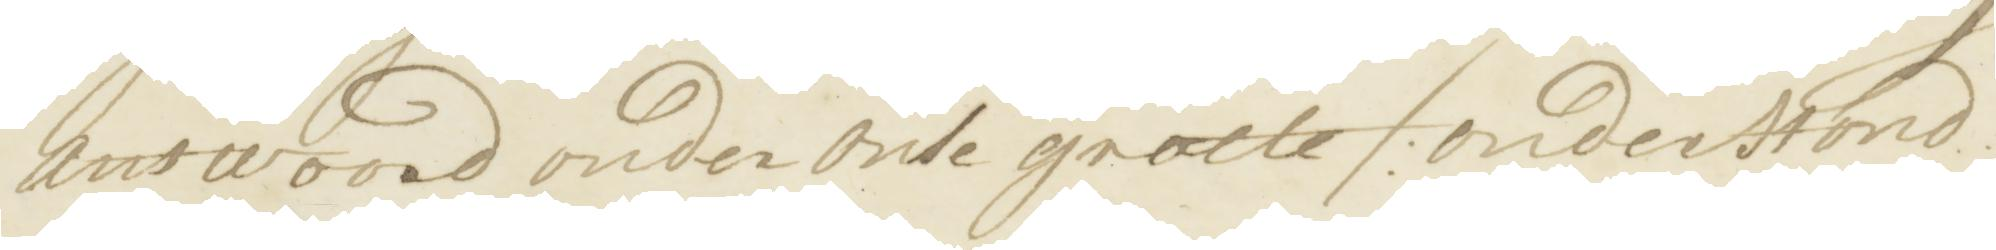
antwoord onder onse groete /: onderstond
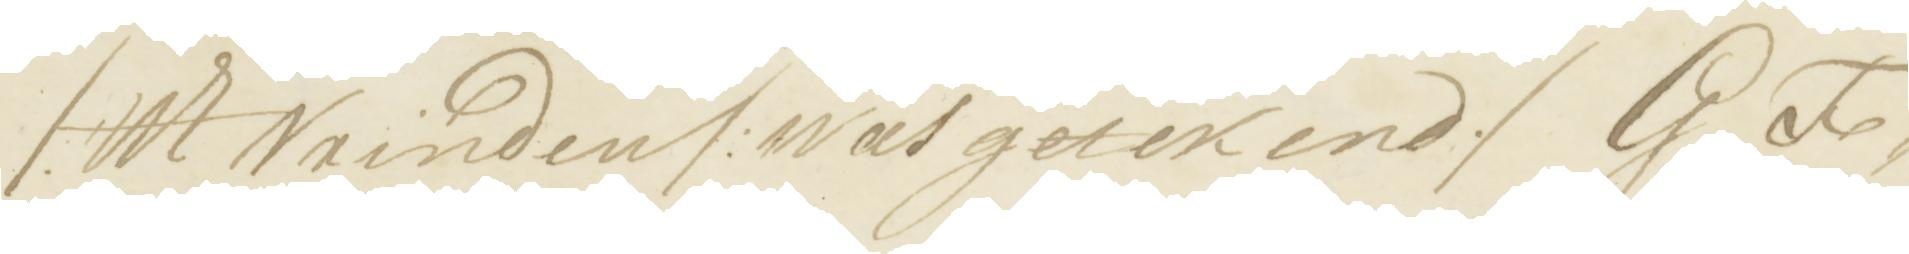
/: Wt Vrinden /: was getekend :/ G F
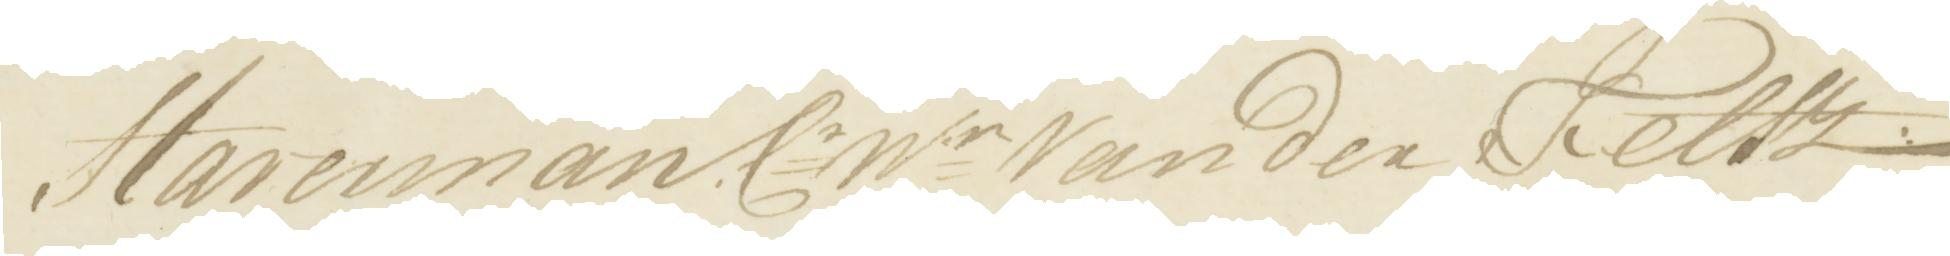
staverman C=r W=m van der Felsz:
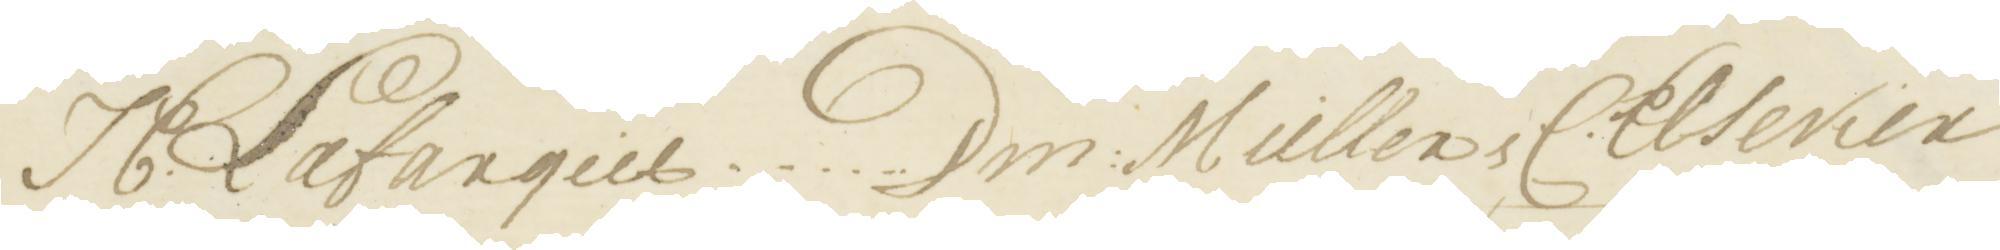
H. Lafargue ...... Dm: Mullers C: Elsevier
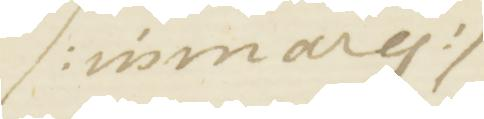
/ :in marg: /
